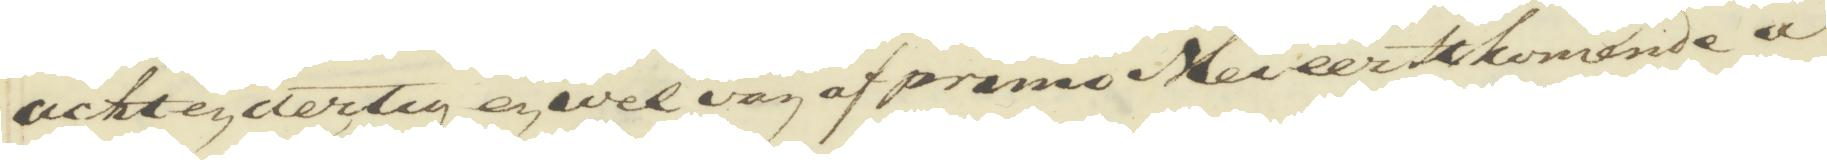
acht en dertig en wel van af primo Mei eerstkomende a
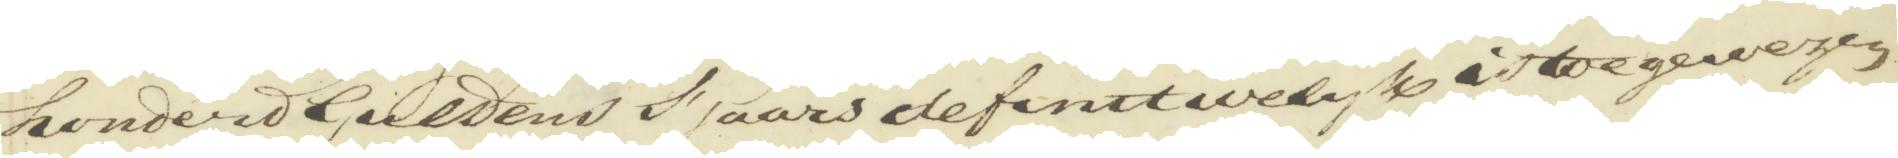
honderd Guldens s' jaars definitivelyk is toegewezen
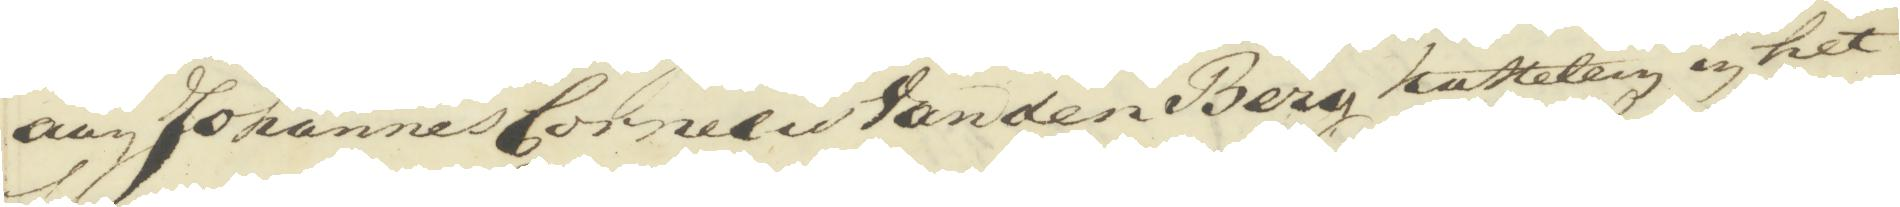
aan Johannes Cornelis Van den Berg kastelein in het
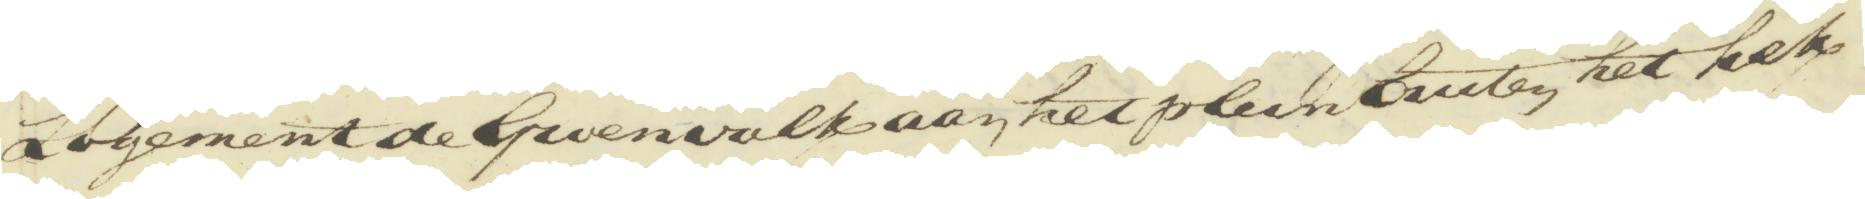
Logement de Groenvalk aan het plein buiten het hek
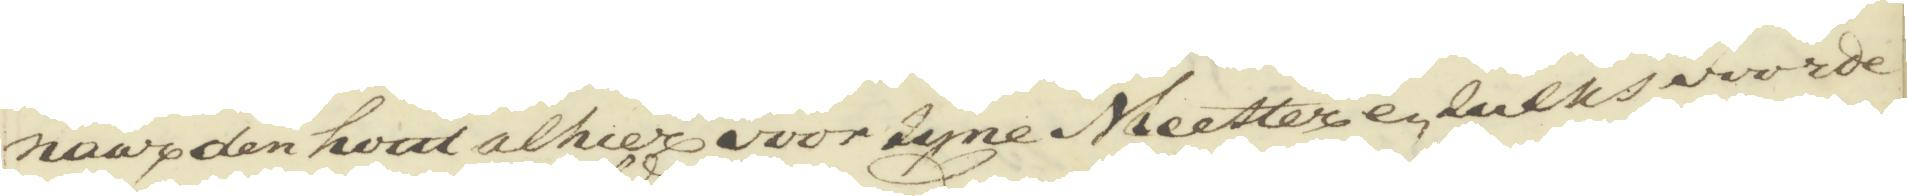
naar den hout alhier voor zyne Meester en zulks voor de
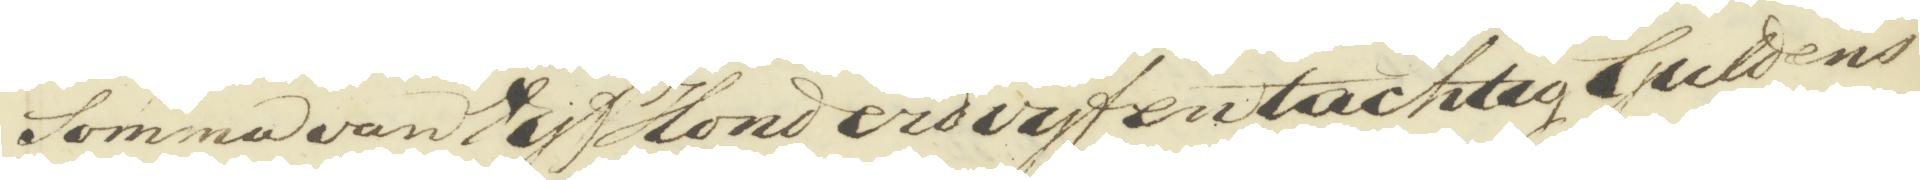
somma van Vijf Honderd vyf en tachtig Guldens
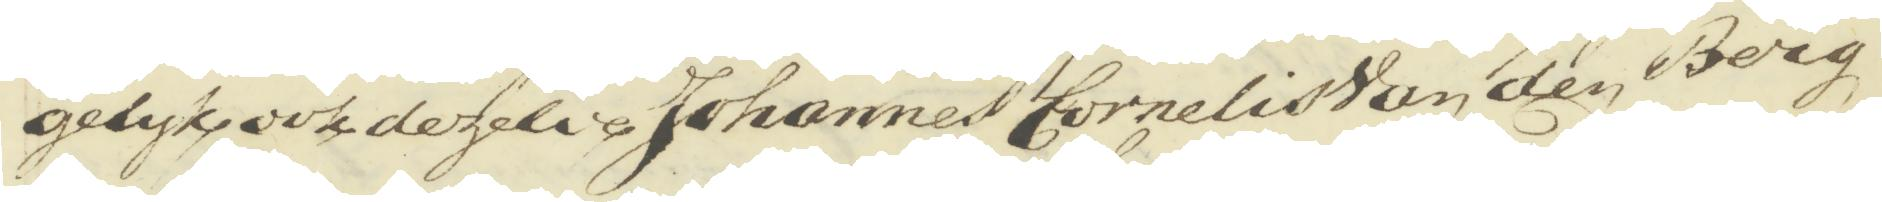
gelyk ook dezelve Johannes Cornelis Van den Berg
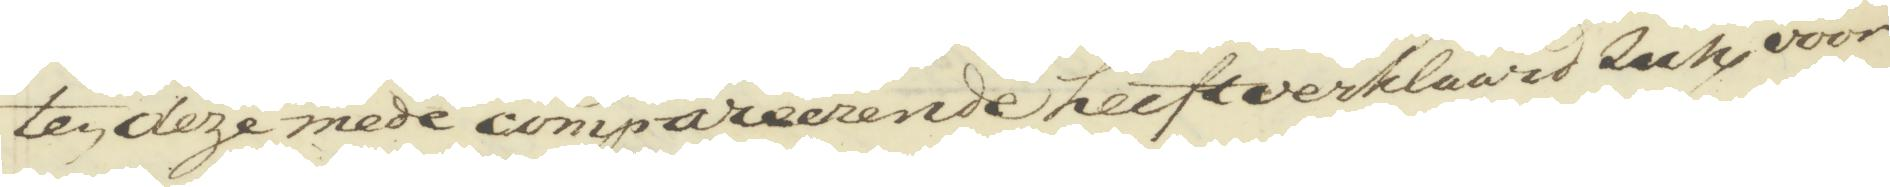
ten deze mede compareerende heeft verklaard zich voor
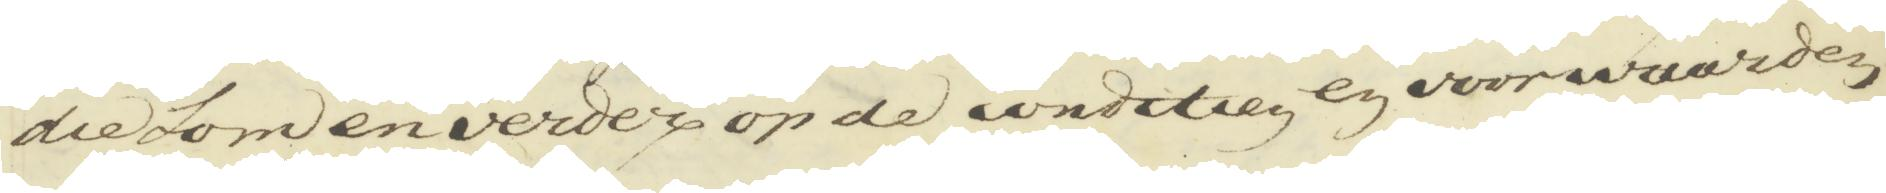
die som en verder op de conditien en voorwaarden
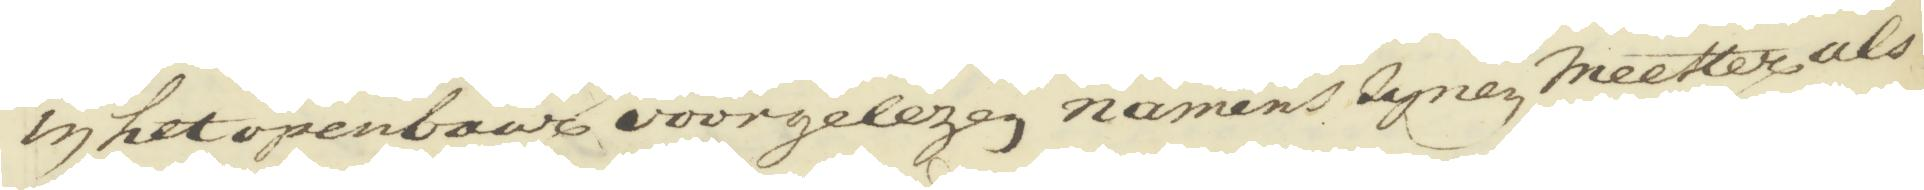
in het openbaar voorgelezen namens zynen meester als
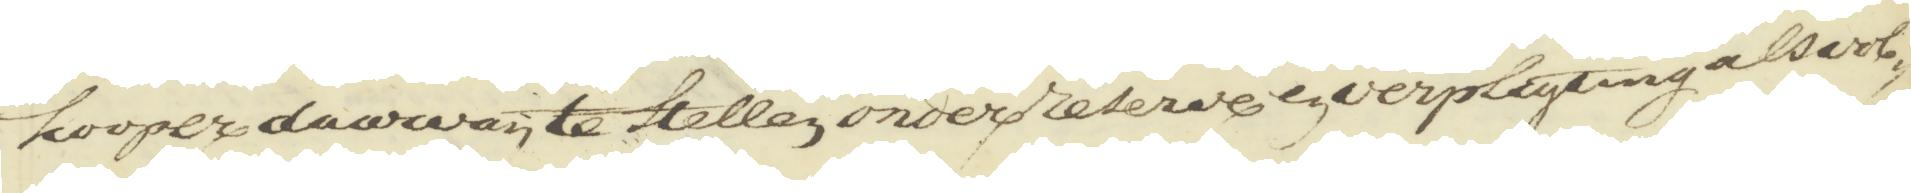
kooper daarvan te stellen onder reserve en verpligting als vol„
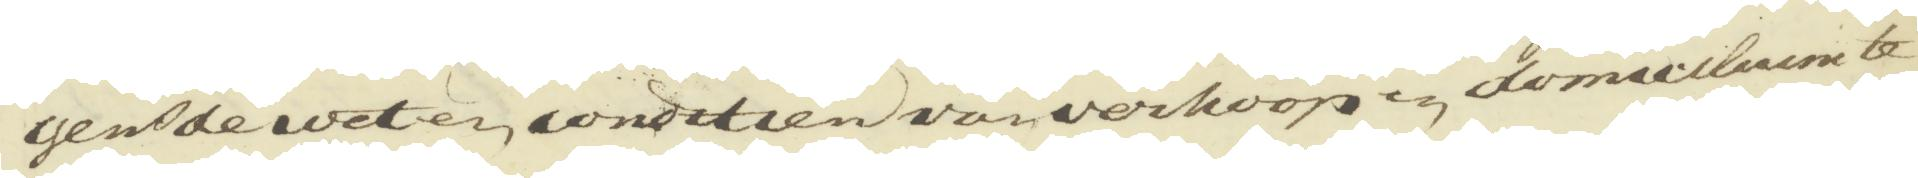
gens de wet en conditien van verkoop en domicilium te
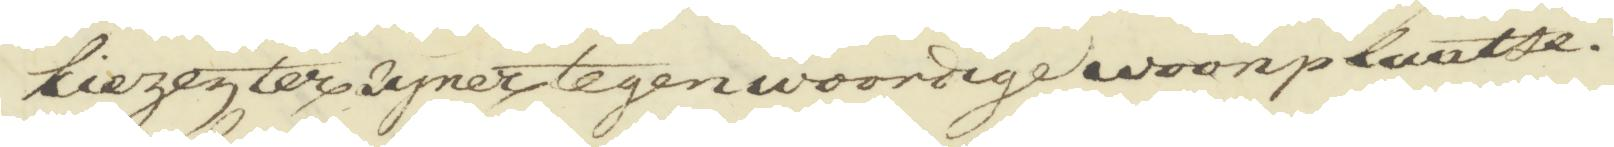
kiezen ter zyner tegenwoordige woonplaatse.
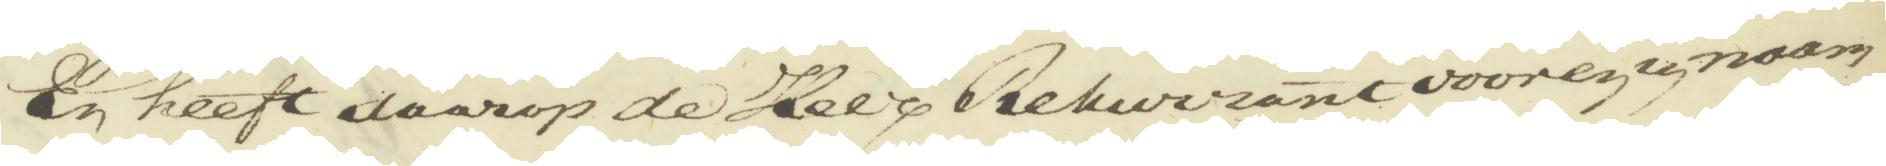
En heeft daarop de Heer Rekurrant vooren in naam
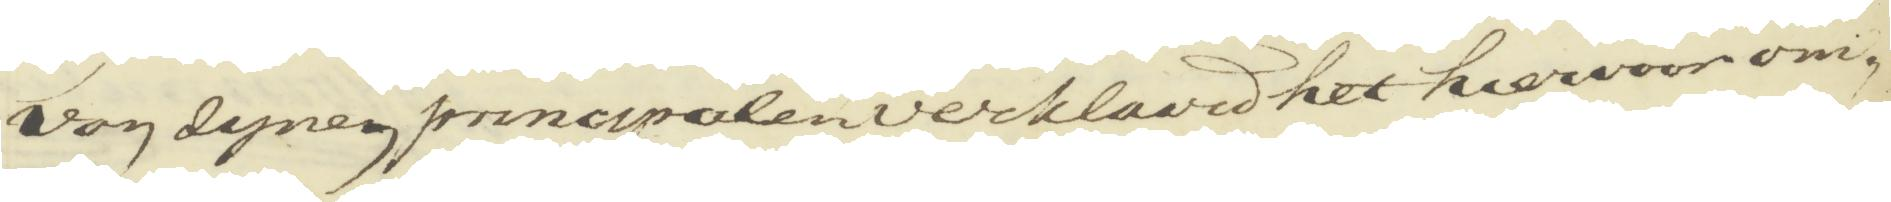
von zynen principalen verklaard het hiervoor om„
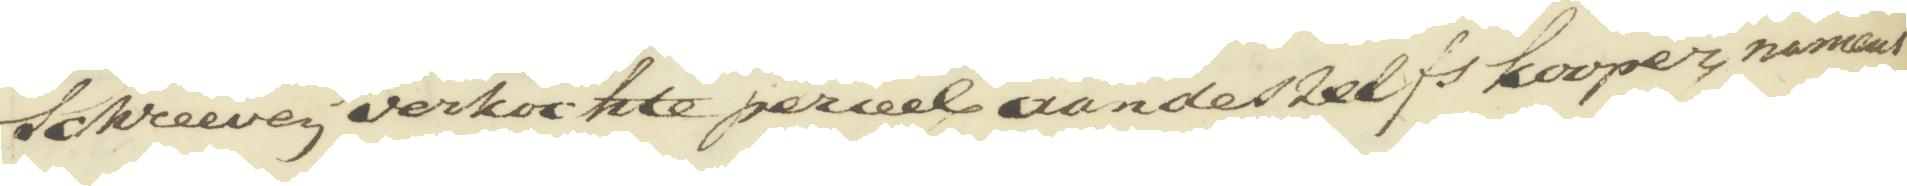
schreeven verkochte perceel aan des zelfs kooper namens
